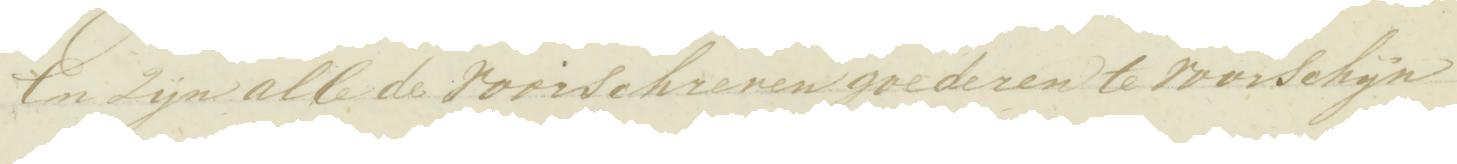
En zijn alle de voorschreven goederen te voorschijn
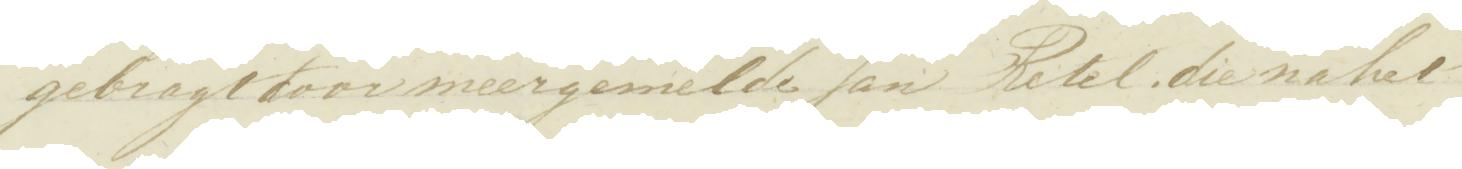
gebragt door meergemelde Jan Ketel, die na het
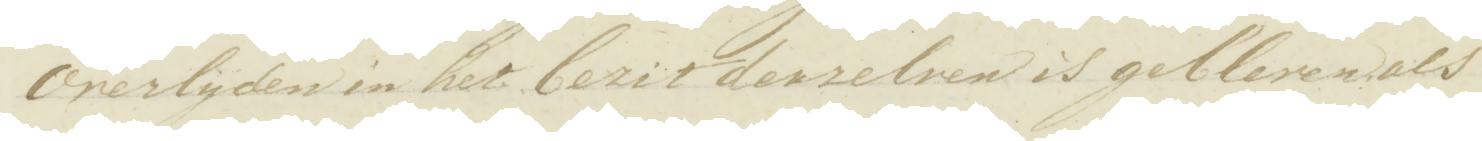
overlijden in het bezit derzelven is gebleven, als
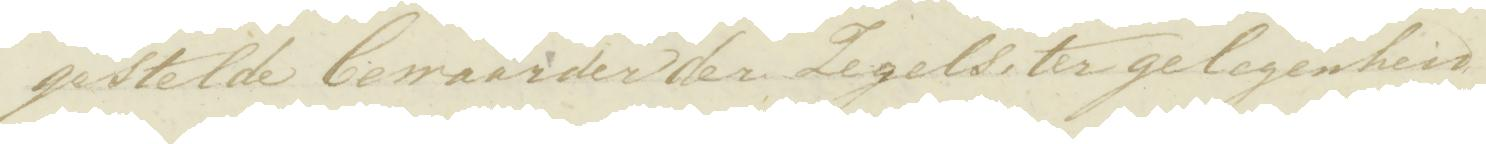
gestelde bewaarder der zegels, ter gelegenheid
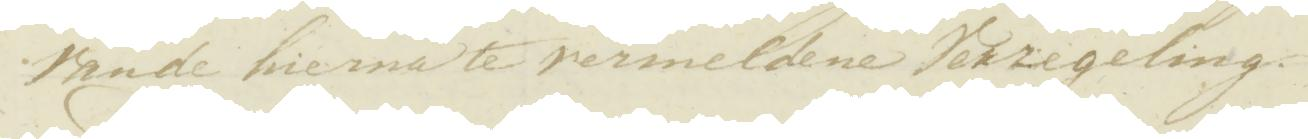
van de hierna te vermeldene Verzegeling.
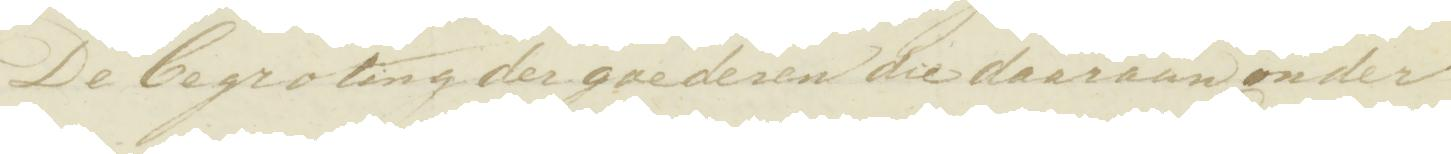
De begroting der goederen die daaraan onder
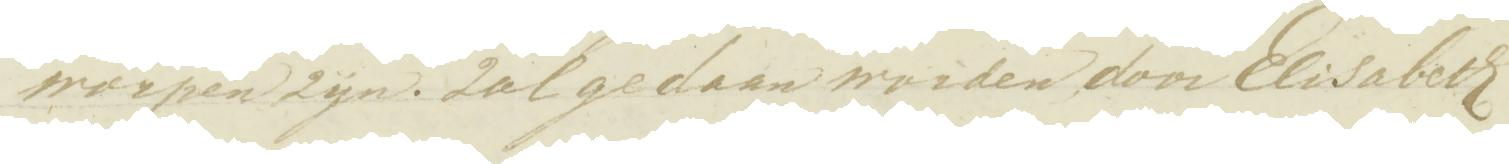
worpen zijn, zal gedaan worden door Elisabeth
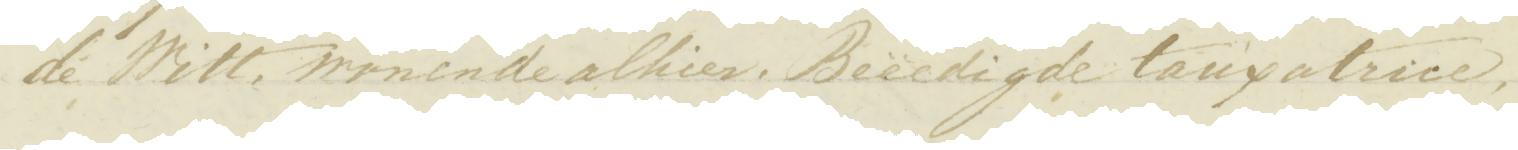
de Witt, wonende alhier. Beëedigde tauxatrice,
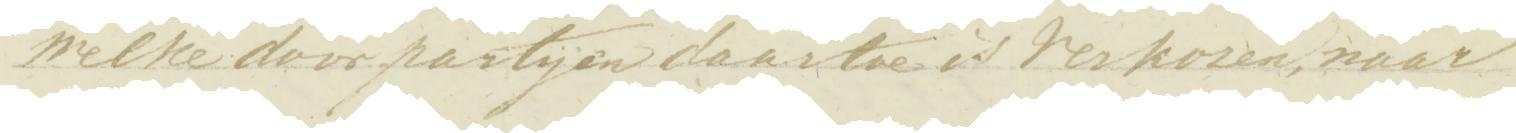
welke door partijen daartoe is verkozen, naar
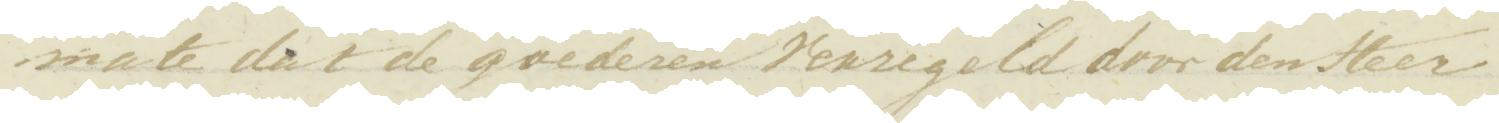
mate dat de goederen verzegeld door den Heer
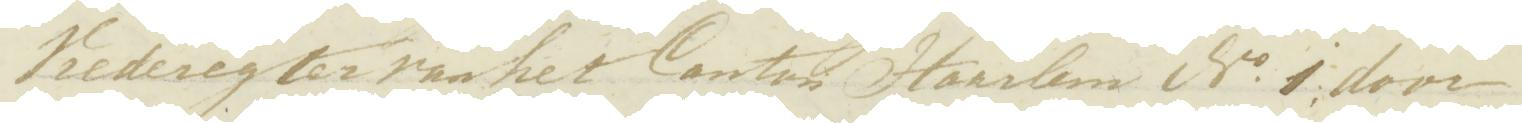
Vrederegter van het Canton Haarlem N.o 1. door
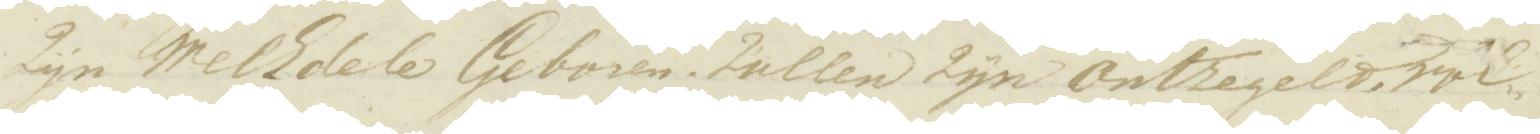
zijn Wel Edele Geboren, zullen zijn ontzegeld, vol„
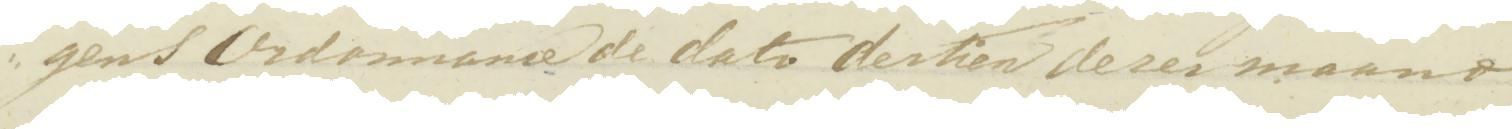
„gens Ordonnance de dato dertien dezes maand
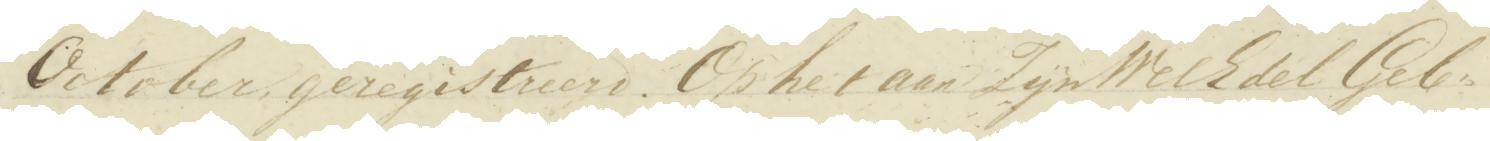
October geregistreerd. Op het aan Zijn Wel Edel Geb„
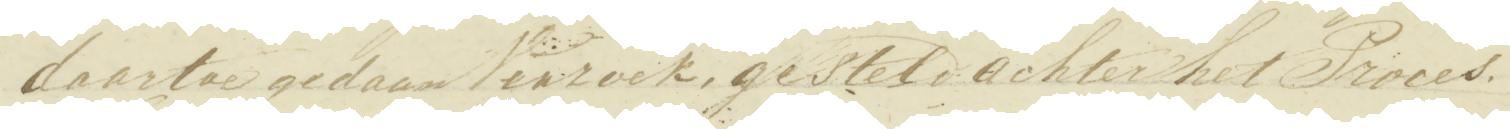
daartoe gedaan Verzoek, gesteld achter het Proces.
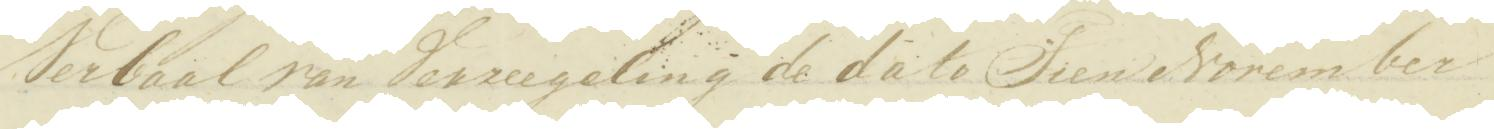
Verbaal van Verzeegeling de dato Tien November
